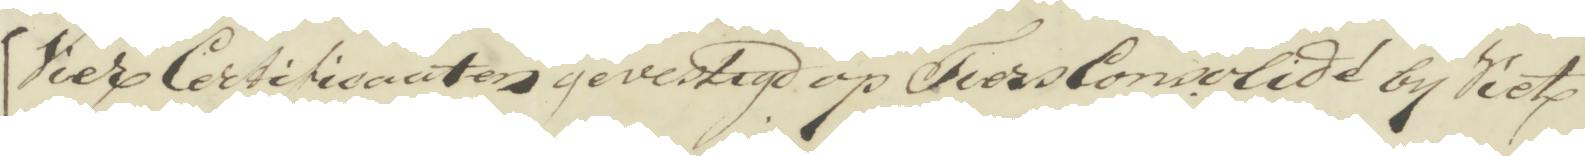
Vier Certificaaten gevestigd op Tiers Consolide by Ket
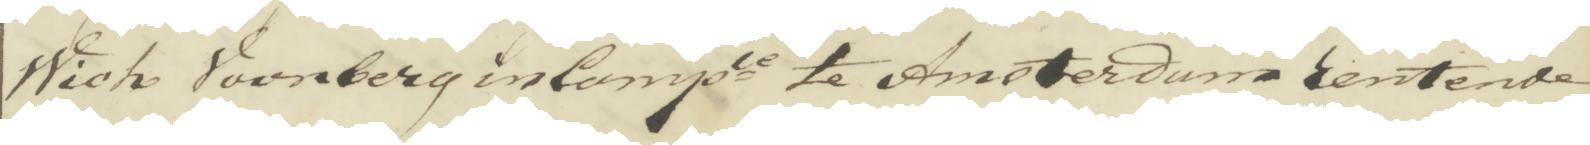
Wich Voorberg in Comp=ie te Amsterdam rentende
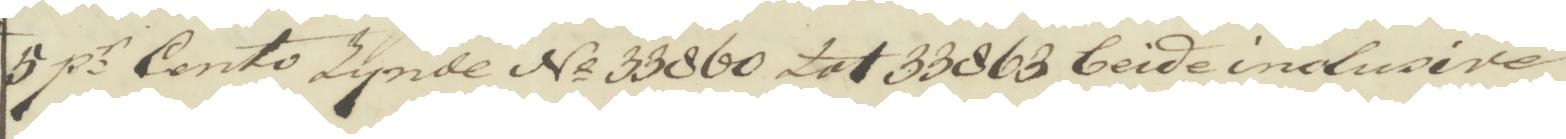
5 p=r Cento Zynde N=o 33860 tot 33863 beide inclusive
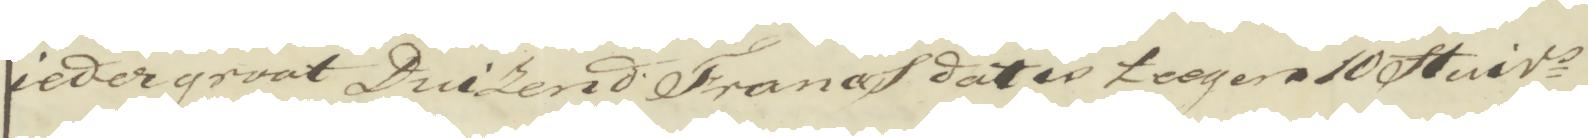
ieder groot Duizend Francs dat is teegen 10 Stuiv=s
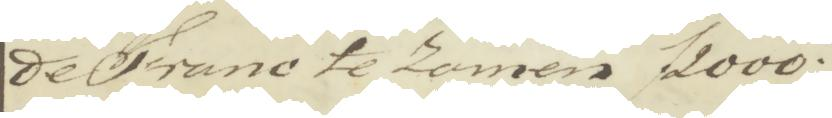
de Franc te zamen ƒ 2000.-
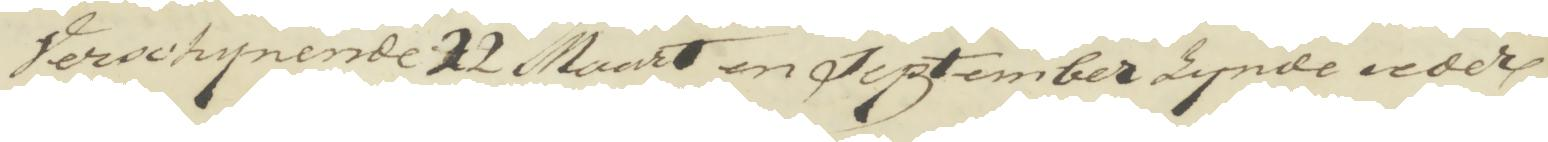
Verschynende 22 Maart en September zynde ieder
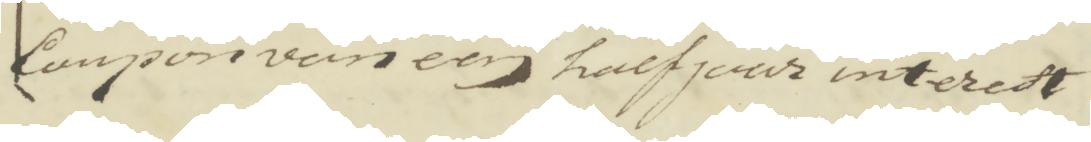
Coupon van een halfjaar interest
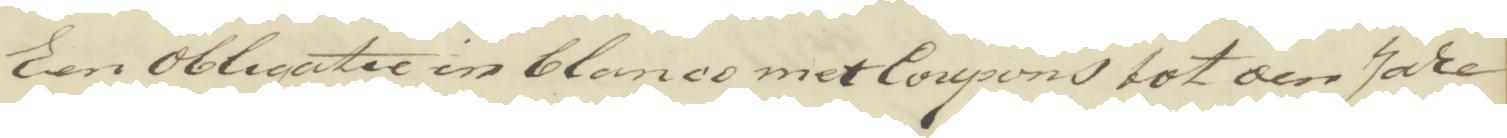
Een obligatie in blanco met Coupons tot den Jare
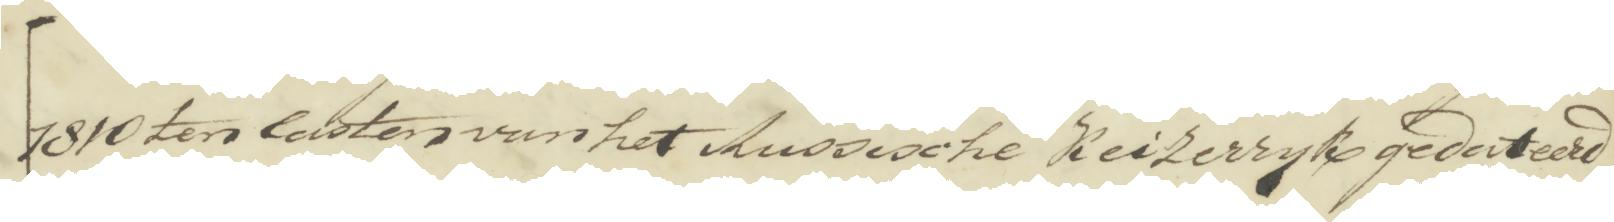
1810 ten lasten van het Russische Keizerryk gedateerd
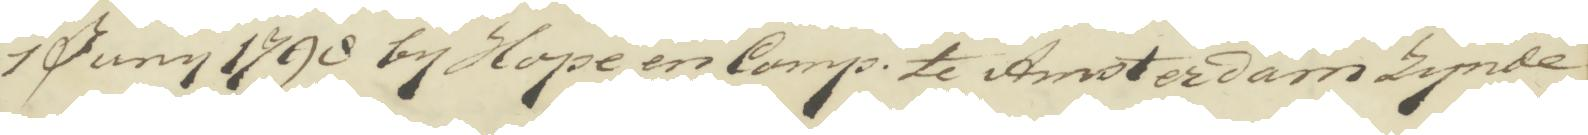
1 Juny 1798 by Hope en Comp. te Amsterdam zynde
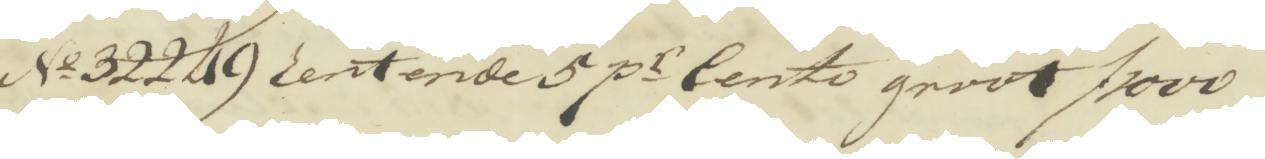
N=o 32249 rentende 5 p-r Cento groot ƒ 1000
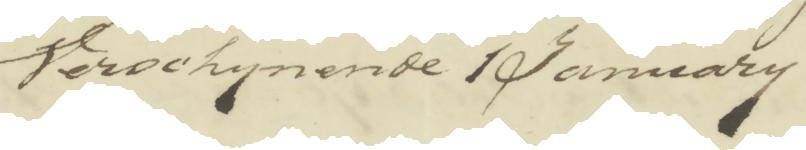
Verschynende 1 January
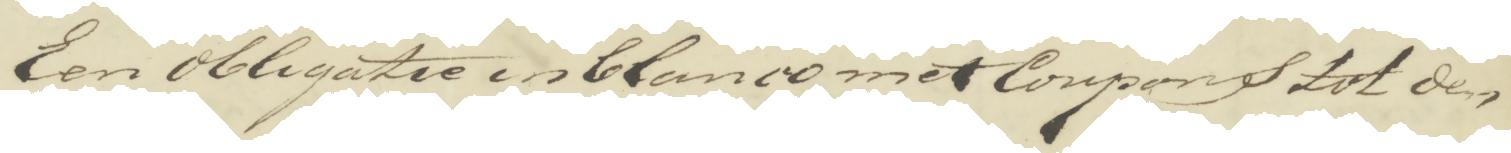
Een obligatie in blanco met Coupons tot den
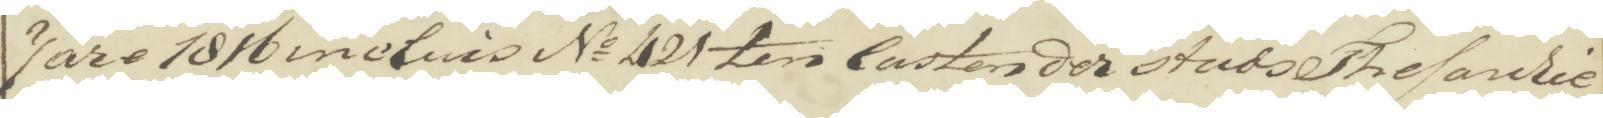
Jare 1816 incluis N=o 421 ten lasten der stads thesaurie
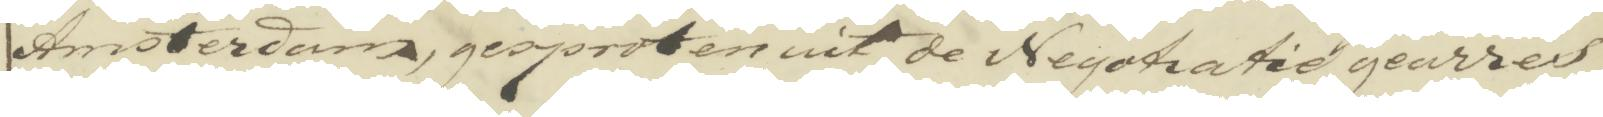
Amsterdam, gesproten uit de Negotiatie gearres
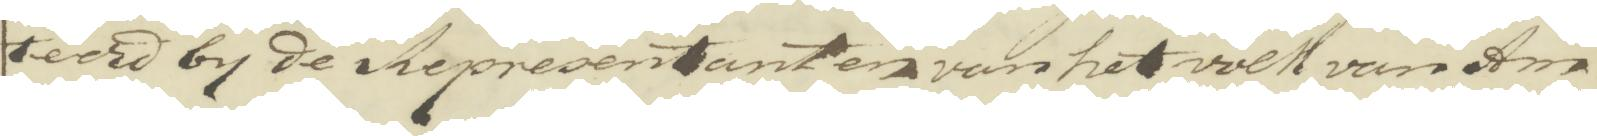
teerd by de Representanten van het volk van Am
